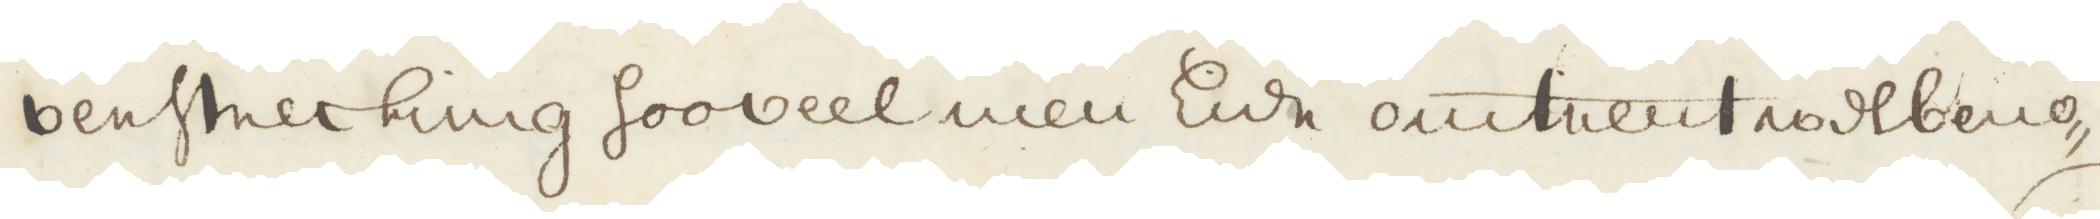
verstrecking sooveel men hier omtrent welbeno„
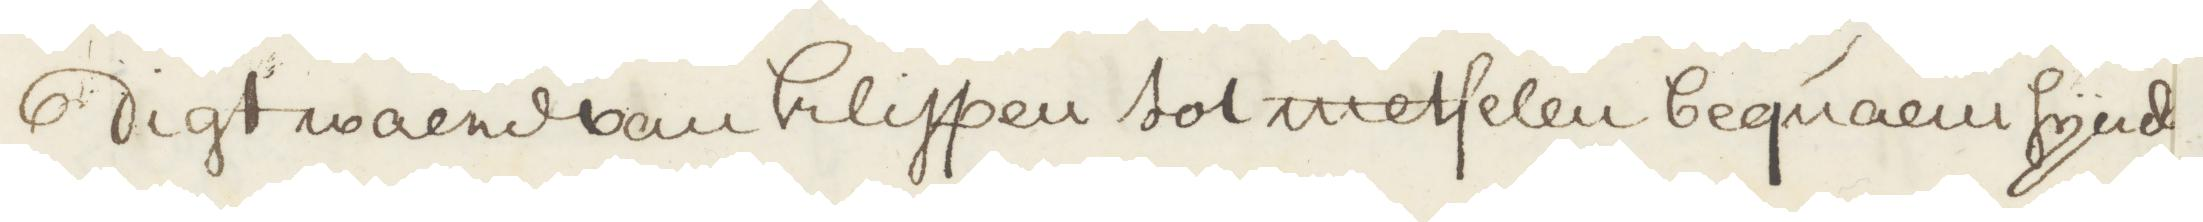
digt waere van klippen tot metselen bequaem sijnd
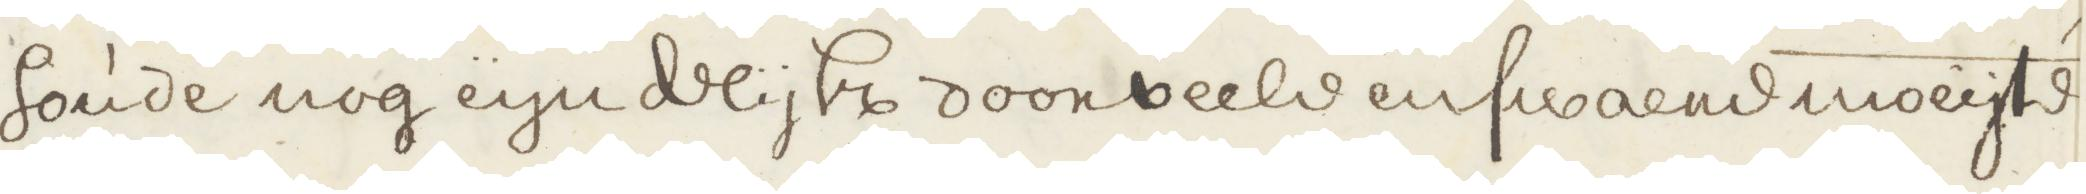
soude nog eijndelijk door veele en swaere moeijte
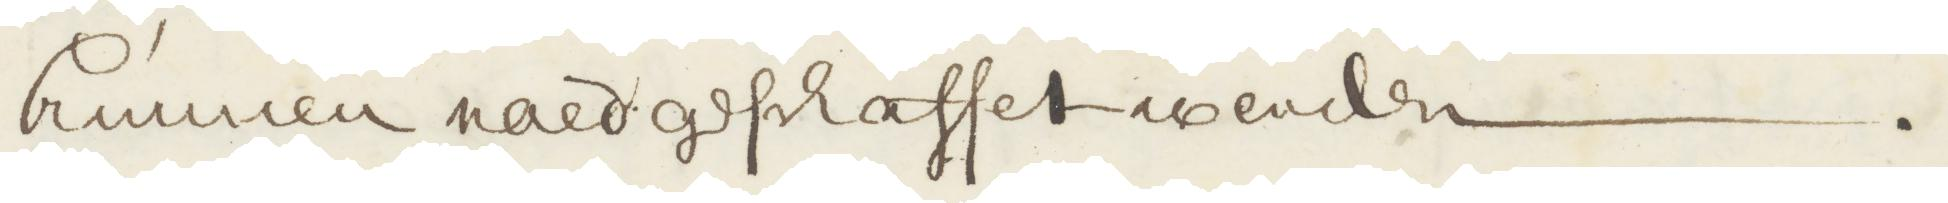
kunnen raed geschaffet werden.
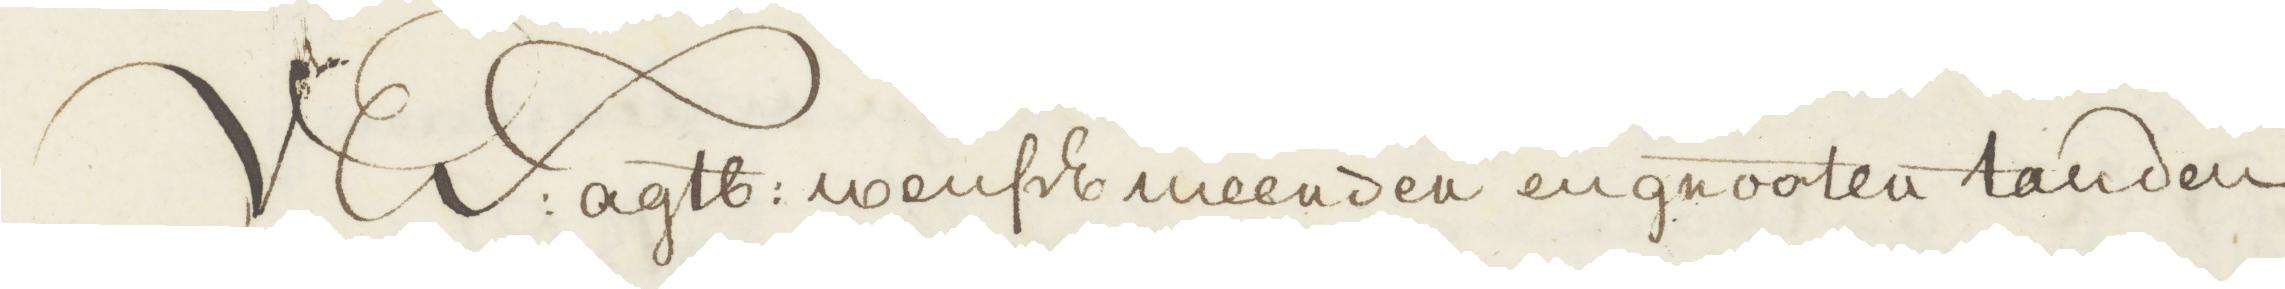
VEE: agtb: wensch meerder en grooten tanden
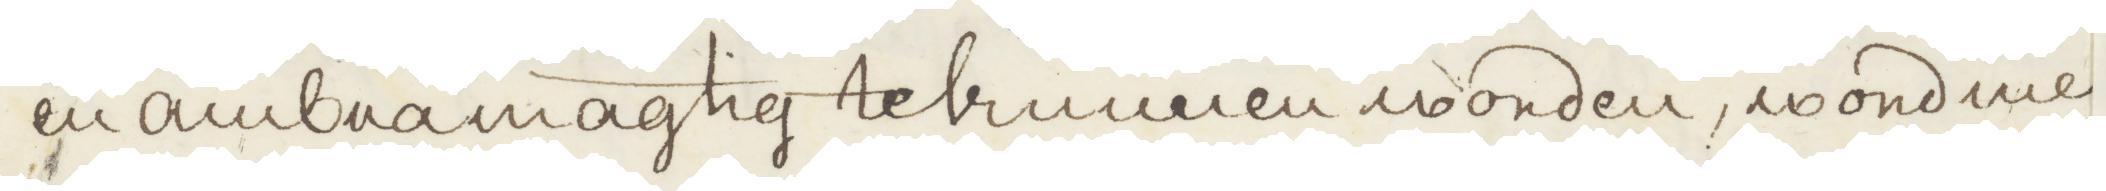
en ambra magtig te kunnen worden, word me
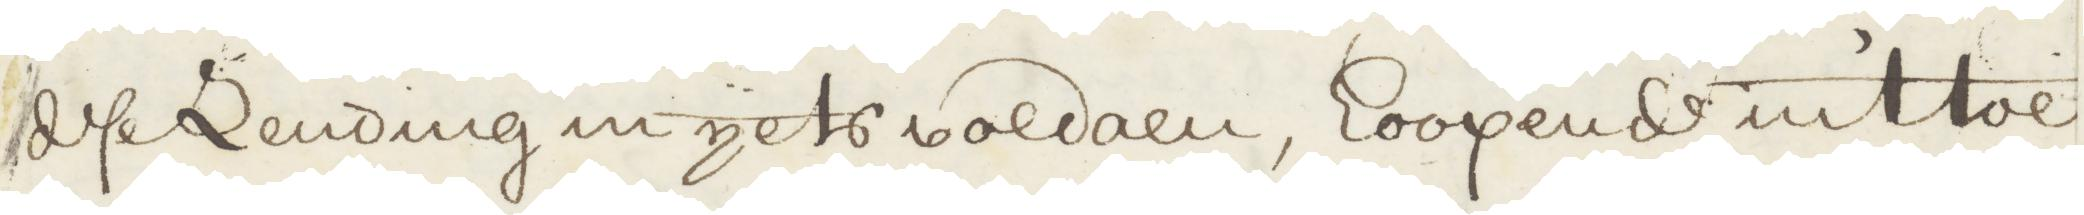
dese zending in ijets voldaen, hoopende in’t toe
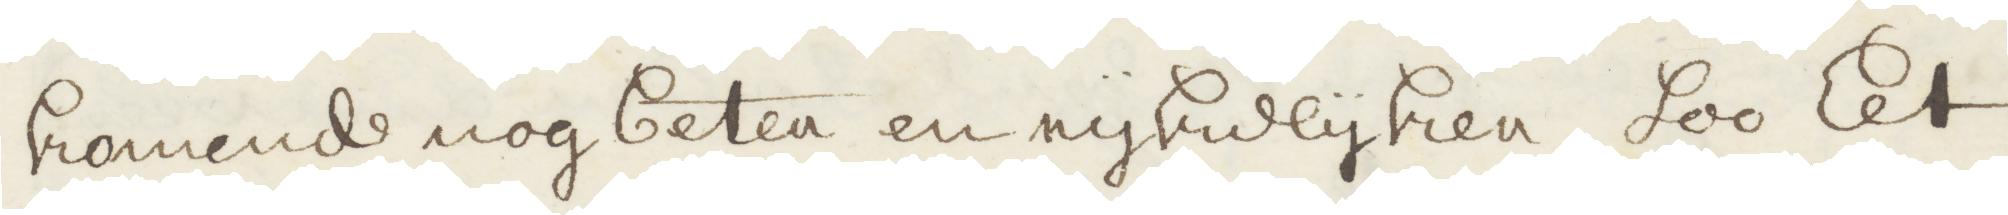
komende nog beter en rijkelijker soo het
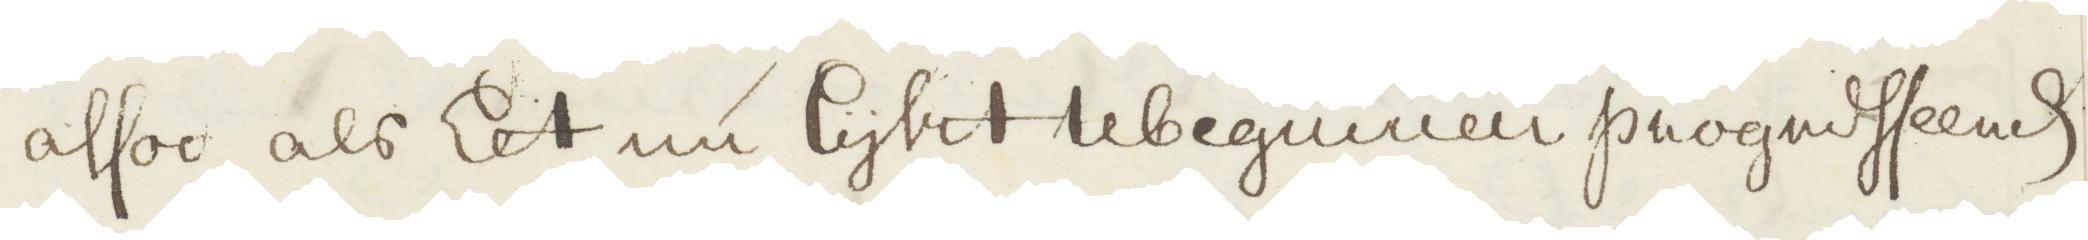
alsoo als het nu lijkt te beginnen prognesseeren
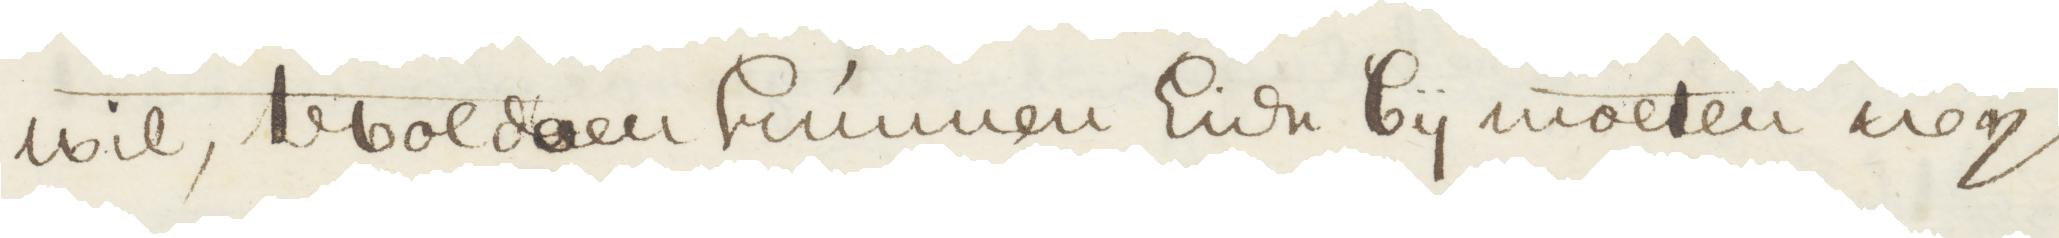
wil, te voldoen kunnen hier bij moeten wij
